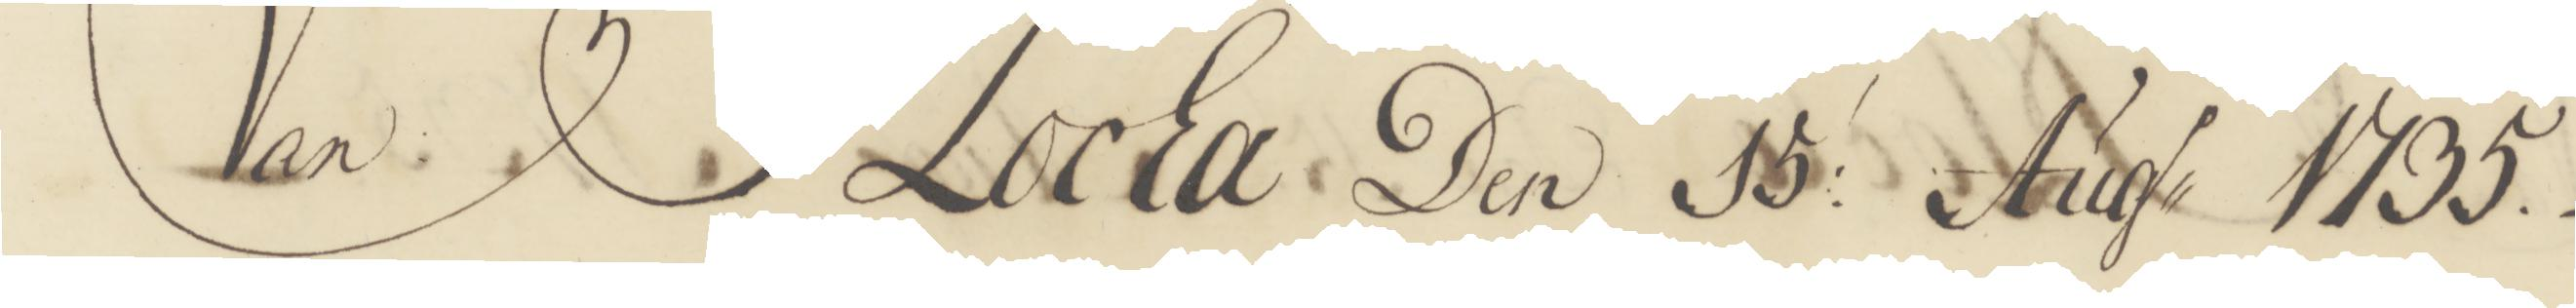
Van Mocha Den 15:' Aug„o 1735.
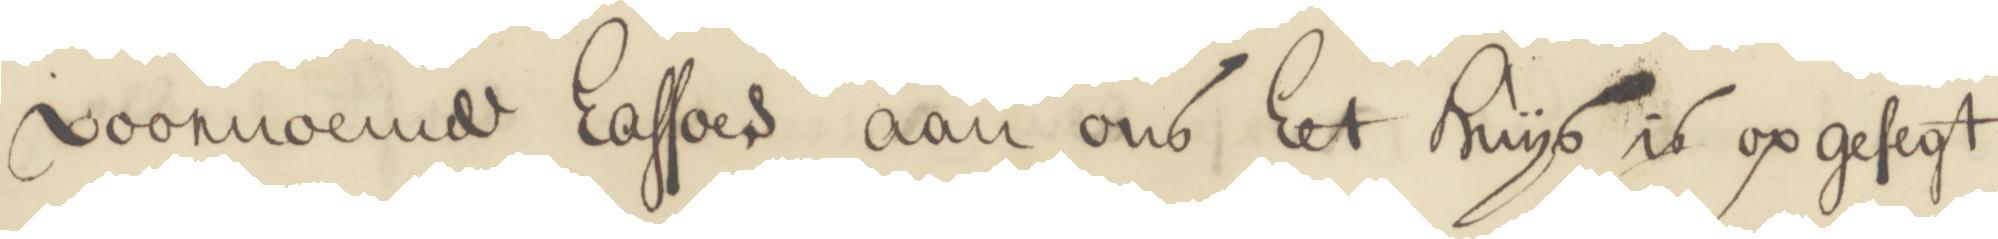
voornoemde hassoes aan ons het huijs is op gesegt
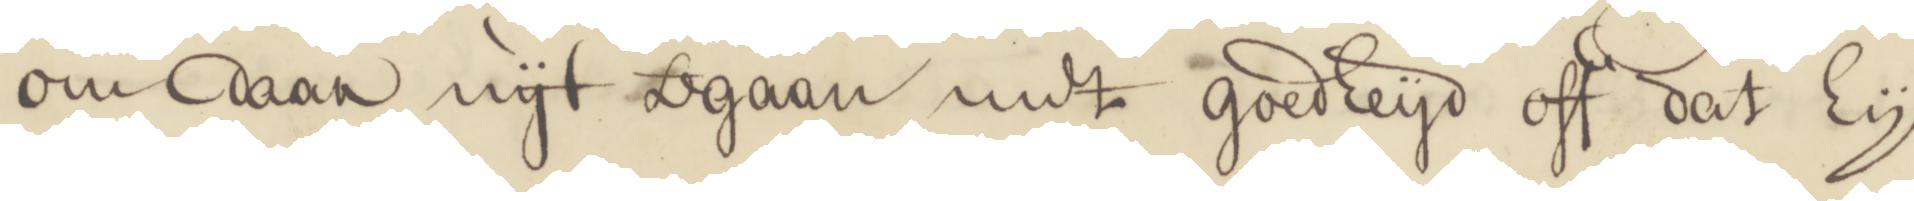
om daar uijt tegaan met goedheijd off dat hij
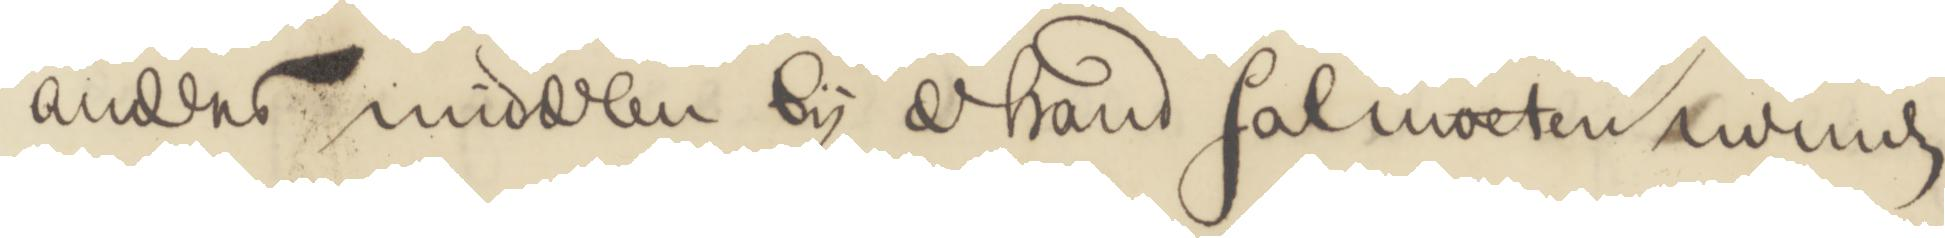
anders middelen bij de hand sal moeten nemen
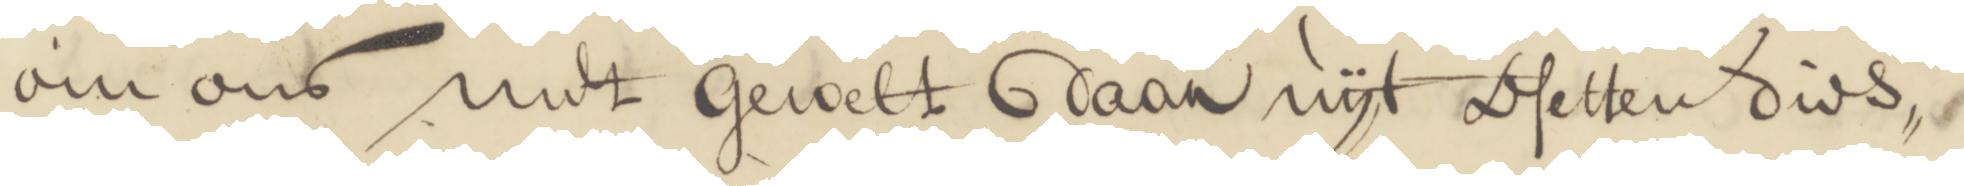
om ons met gewelt daar uijt tesetten dies„
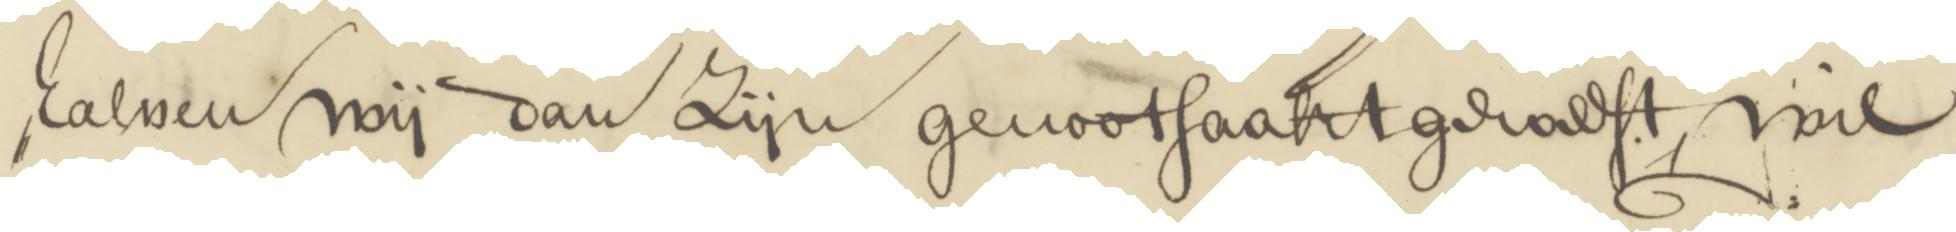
„halven wij dan zijn genootsaakt geweest, wil
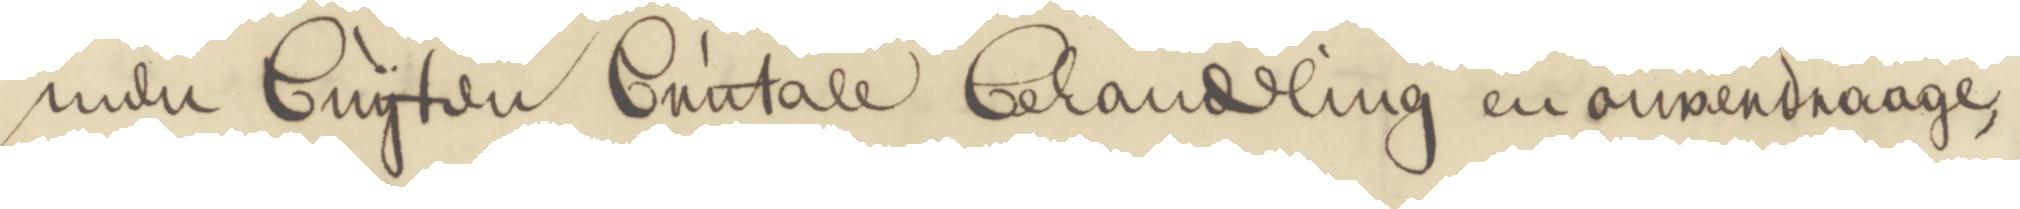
men buijten brutale behandeling en onverdraage,
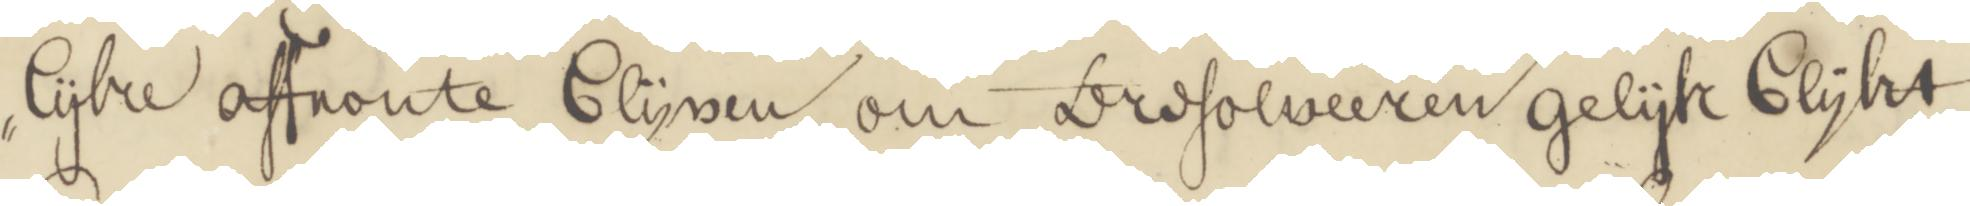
„lijke affronte blijven om te resolveeren gelijk blijkt
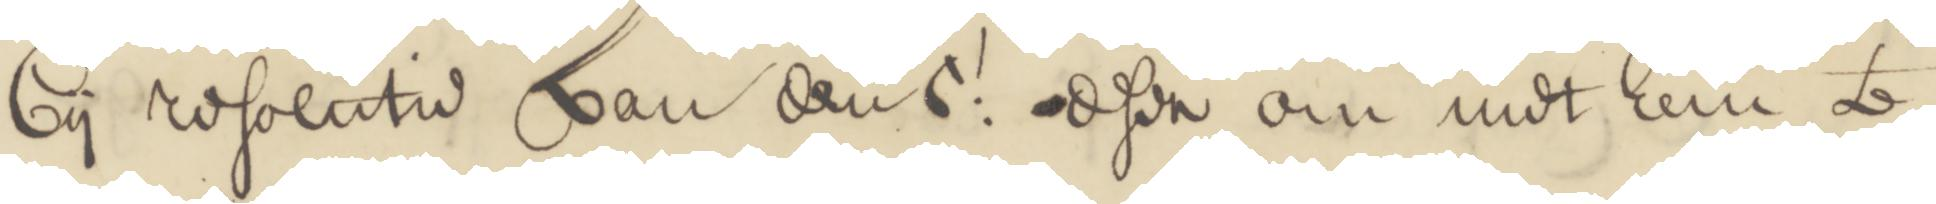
bij resolutie van den 5:' deser om met hem te
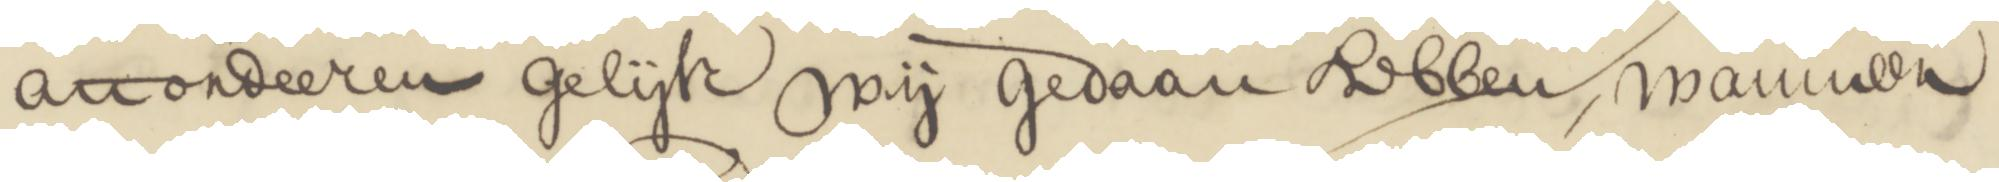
accordeeren gelijk wij gedaan hebben, wanneer
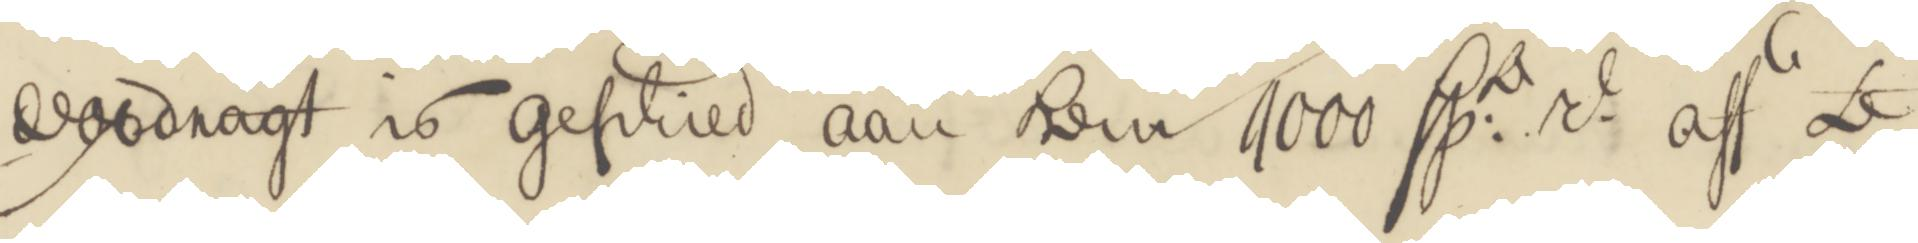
de opdragt is geschied aan hem 4000 sp:se r.l aff te
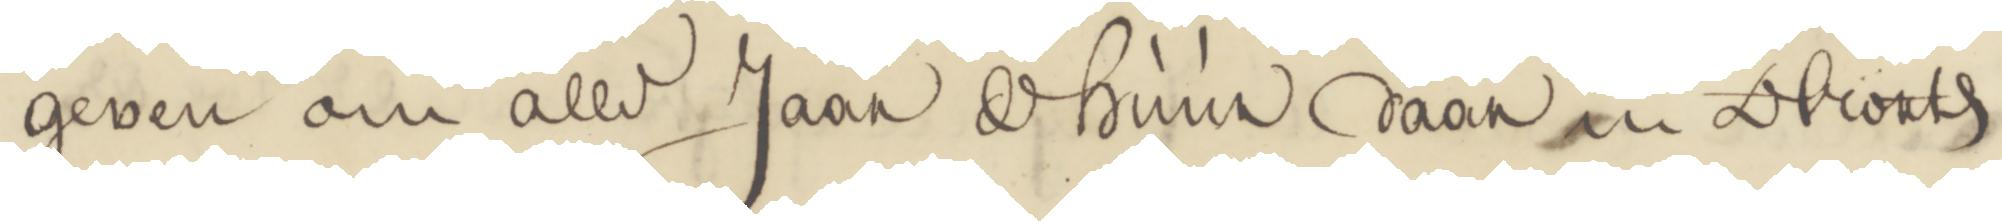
geven om alle Jaar de huur daar in te korten
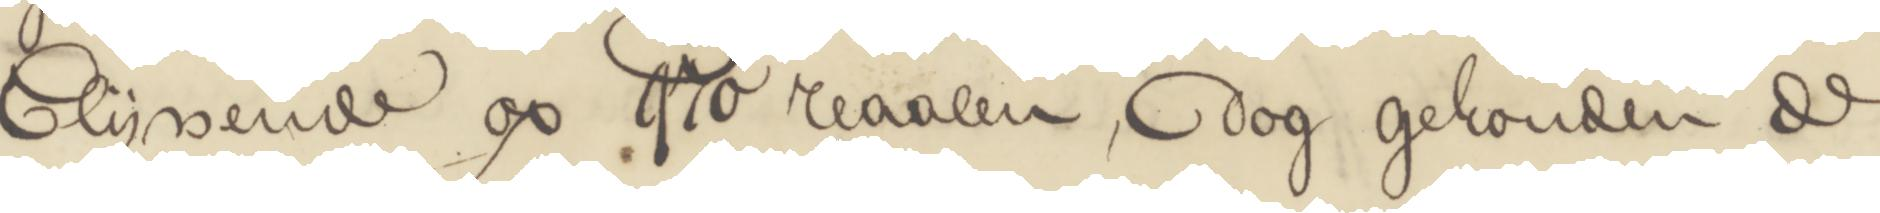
blijvende op 470 reaalen, dog gehouden de
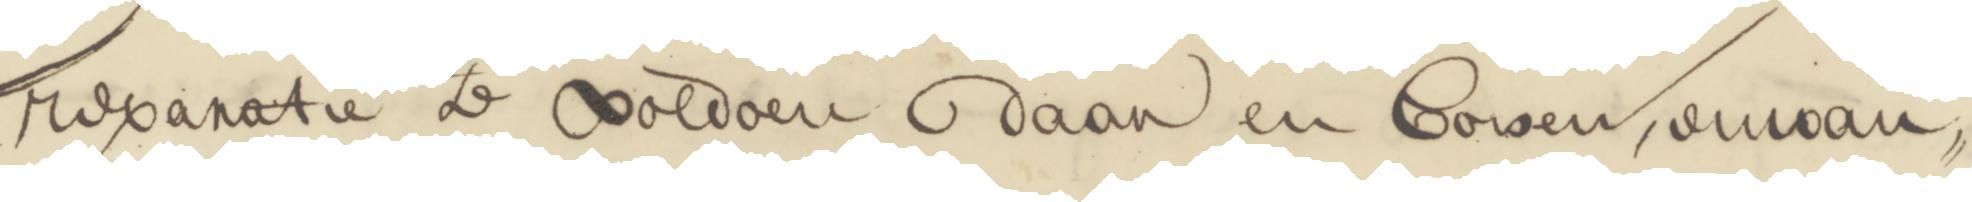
reparatie te voldoen daar en boven, en wan„
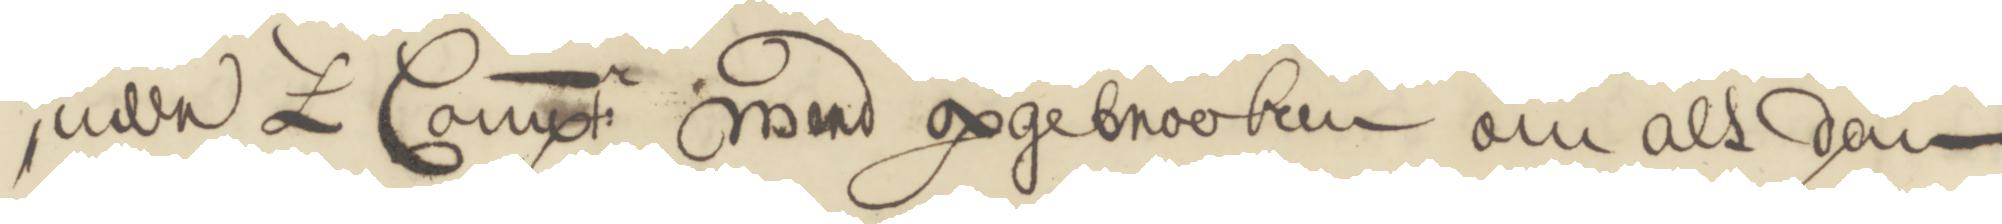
„neer 't Compt:r werd opgebrooken om als dan
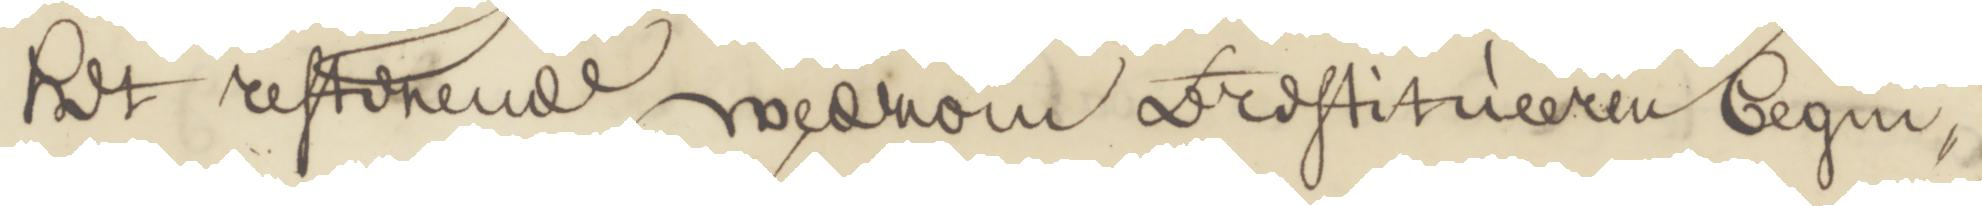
het resterende wederom te restitueeren begin„
